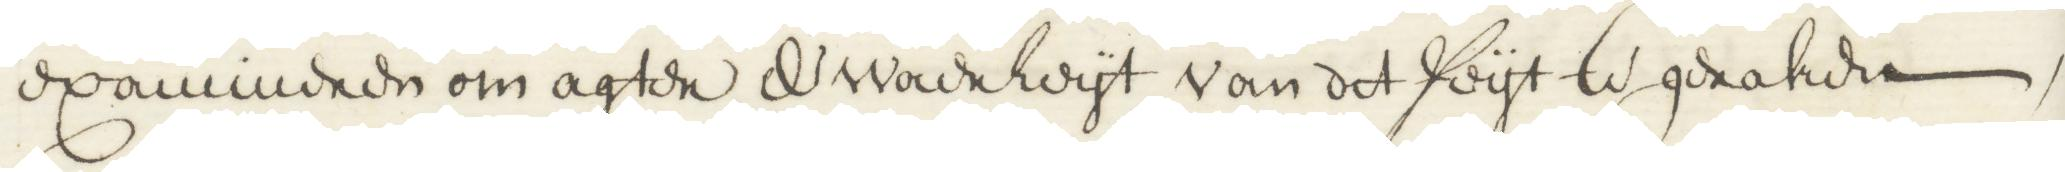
examineren om agter de waerheijt van dit feijt te geraken,
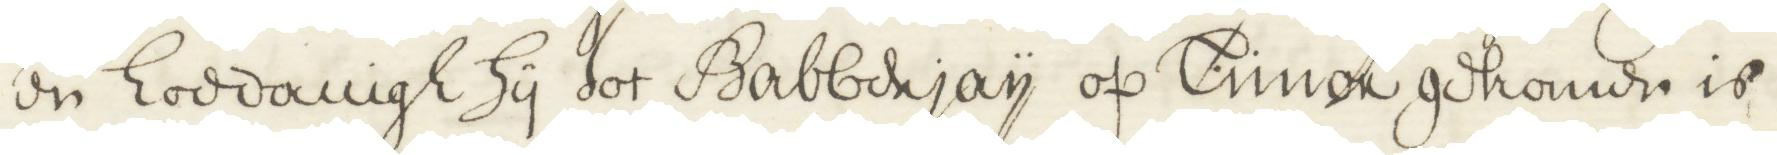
en hoedanigh hij tot Babberjaij op Timor gekomen is
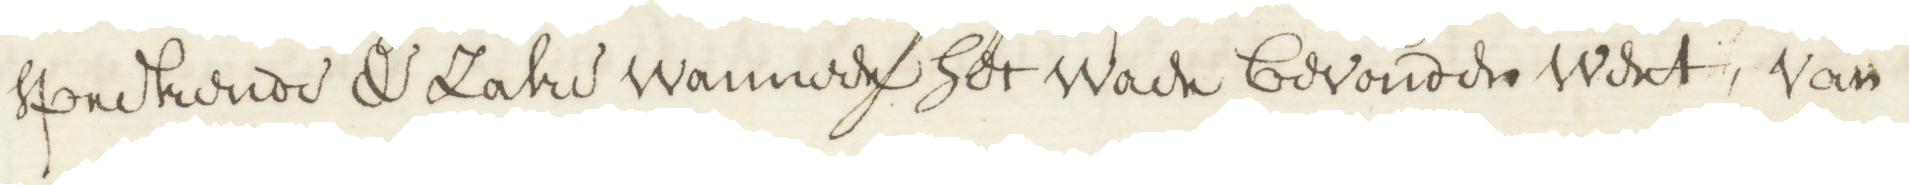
sprekende de zake wanneer het waer bevonden wert, van
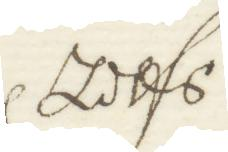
zelfs
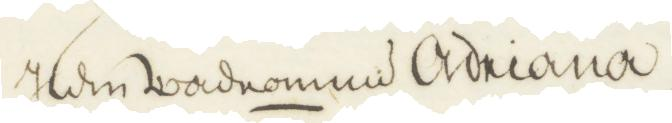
Jtem waeromme Adriana
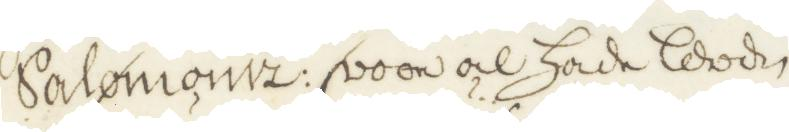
Salomonsz: voor al haer leven
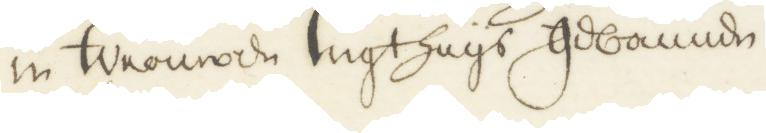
in tvrouwen tugthuijs gebannen
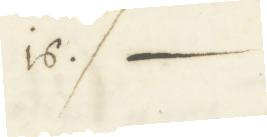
is./ —
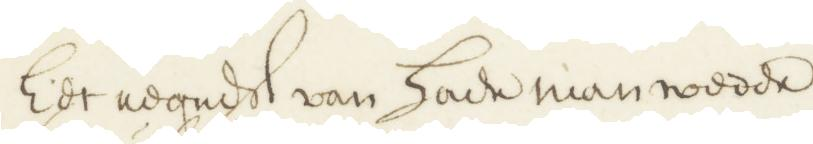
het request van haer man weder
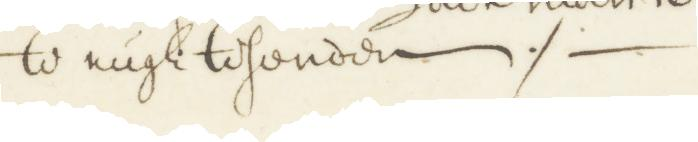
te rugh tesenden./ —
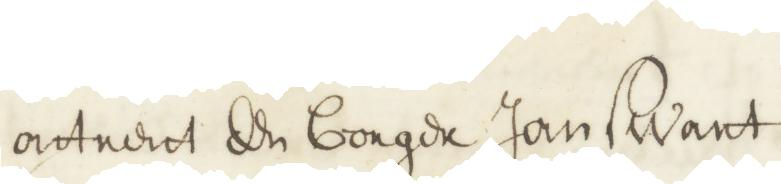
ontrent den borger Jan Swart
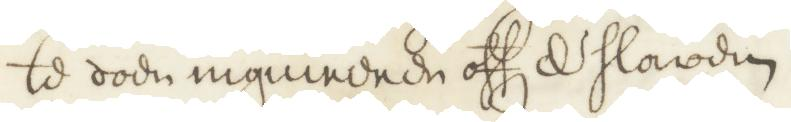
te doen inquireren off de slaven
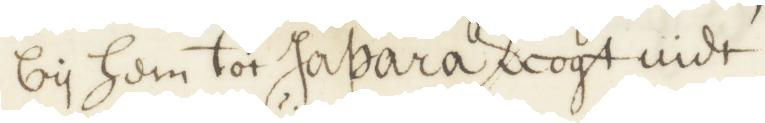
bij hem tot Japara vercogt niet
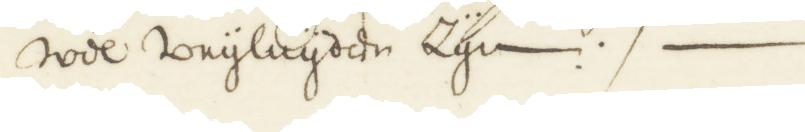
wel vrijluijden zijn./ —
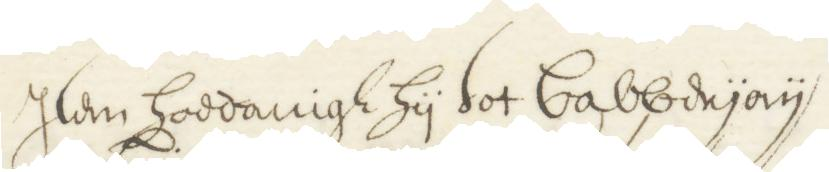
Item hoedanigh hij tot babberjaij
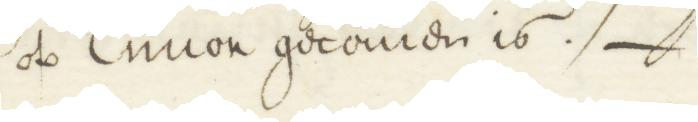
op Timor gecomen is ./ —
